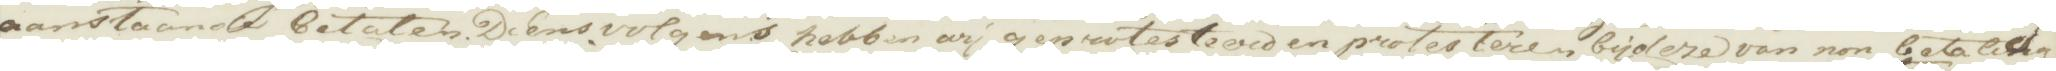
aanstaande betalen Diens volgens hebben wij geprotesteerd en protesteren bij deze van non betaling
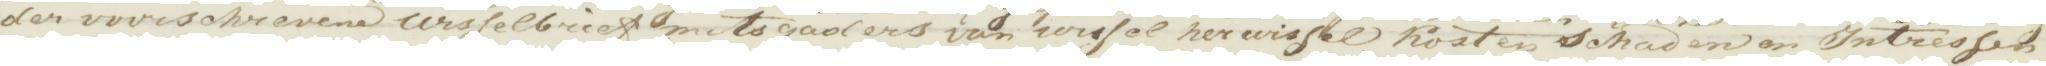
der voorschrevene wisselbrief mitsgaders van wissel herwissel kosten schaden en Intressen
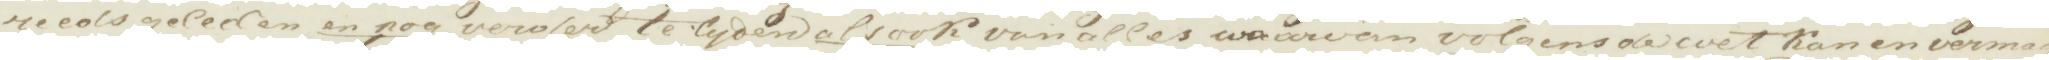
reeds geleden en nog verder te lyden als ook van alles waarvan volgens de wet kan en vermag
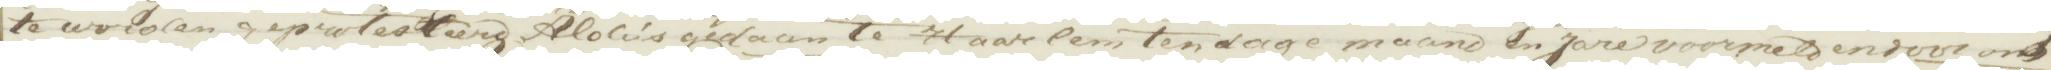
te worden geprotesteerd Aldus gedaan te Haarlem ten dage maand en Jare voormeld en door ons
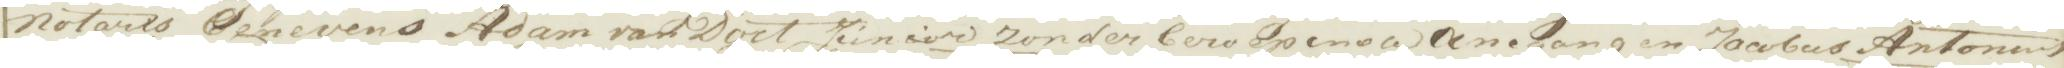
Notaris benevens Adam van Dort Junior zonder beroep in de Anegang en Jacobus Antonius
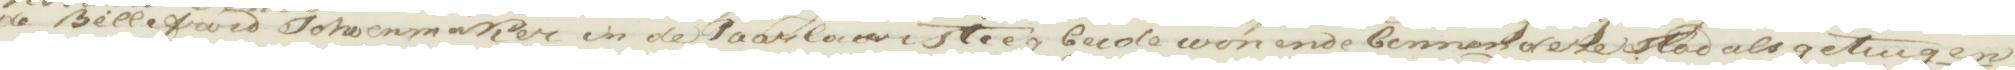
de Bellefroid schoenmaker in de Paarlaarsteeg beide wonende binnen deze stad als getuigen
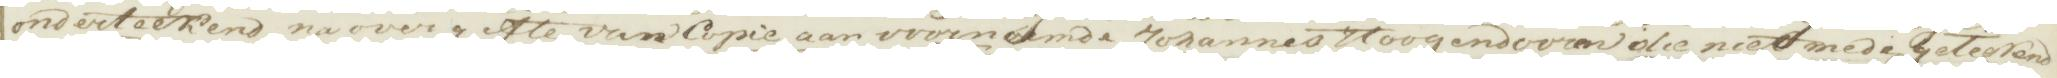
onderteekend na overgifte van Copie aan voornoemde Johannes Hoogendooren die niet mede geteekend
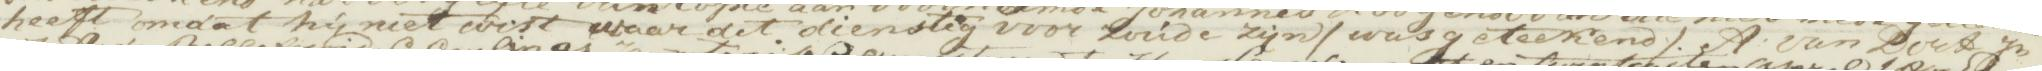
heeft omdat hij niet wist waar dit dienstig voor zoude zijn / was geteekend ./. A: van Dort Jr
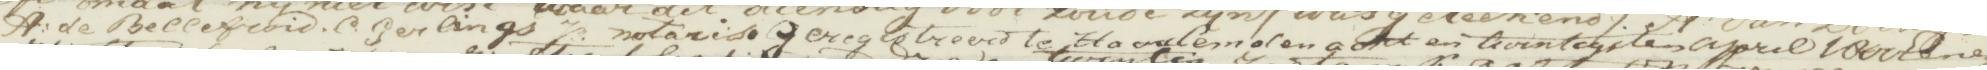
J. A: de Bellefroid, C. Gerlings J„r notaris Geregistreerd te Haarlem den acht en twintigsten April 1800 Eenen
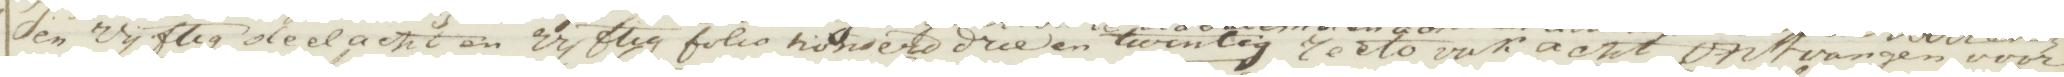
en vijftig deel acht en vyftig folio honderd drie en twintig recto vak acht ontvangen voor
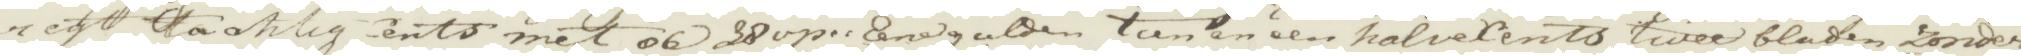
regt tachtig Cents met de 38 opc: Eene gulden tien en een halve Cents twee bladen zonder
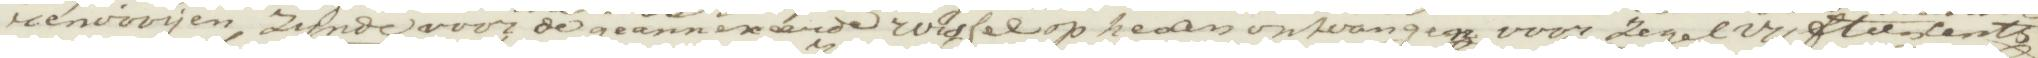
renvooijen, zynde voor de geannexeerde wissel op heden ontvangen voor zegel vyftien Cents
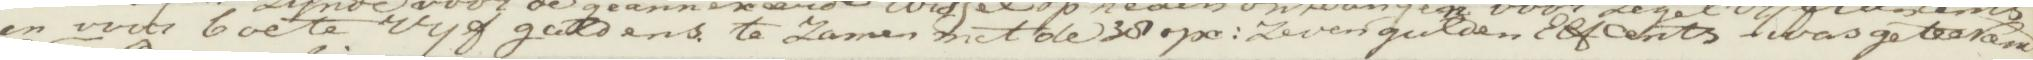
en voor boete vyf guldens te zamen met de 38 opc: Zeven gulden Elf Cents / was geteekend /
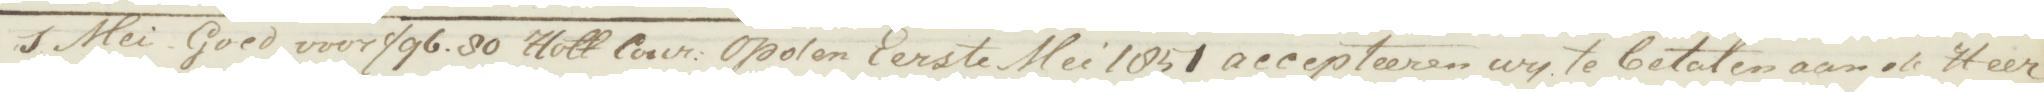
1 Mei Goed voor ƒ 96.80 Holl Cour: op den Eerste Mei 1851 accepteeren wy te betalen aan de Heer
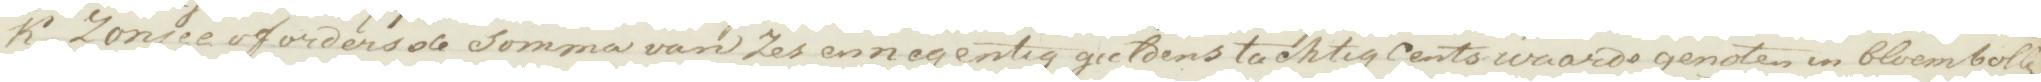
K Zonjee of orders de somma van Zes en negentig guldens tachtig Cents waarde genoten in bloembollen
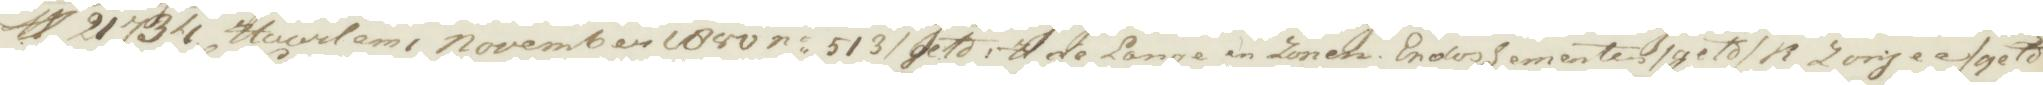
N 21734. Haarlem, November 1850 n„o 513 / getd: H de Lange en Zonen. Endossementen / getd / K Zonjee / getd
